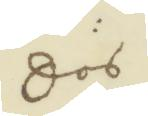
d:os
